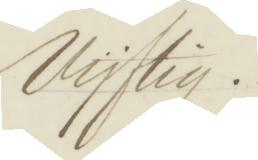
Vijftig.
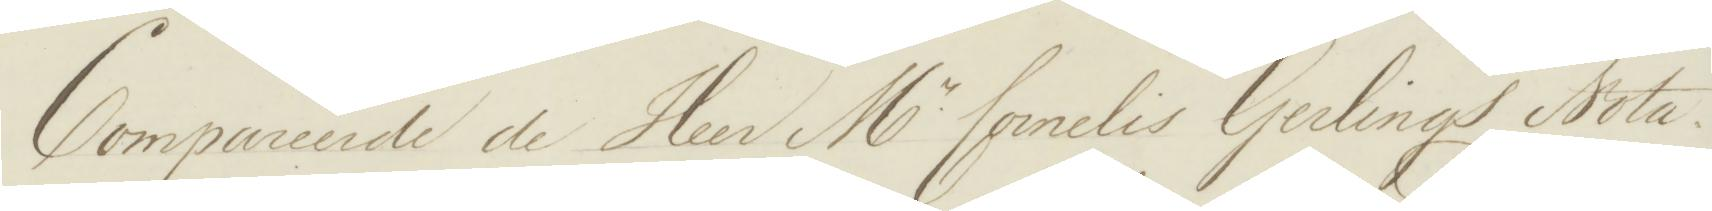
Compareerde de Heer M:r Cornelis Gerlings Nota„
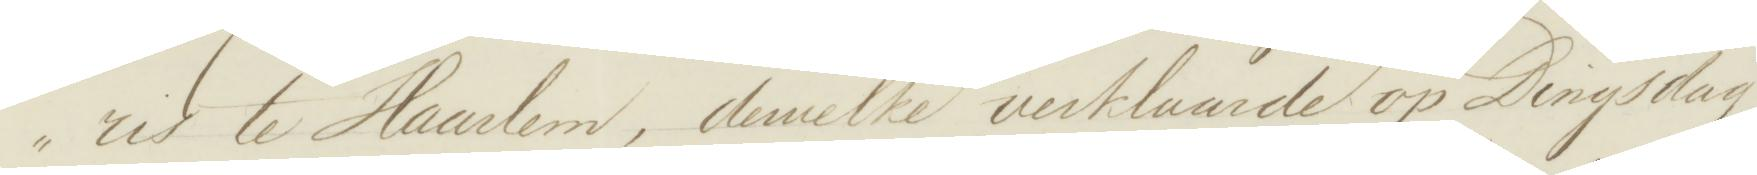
„ ris te Haarlem, dewelke verklaarde op Dingsdag
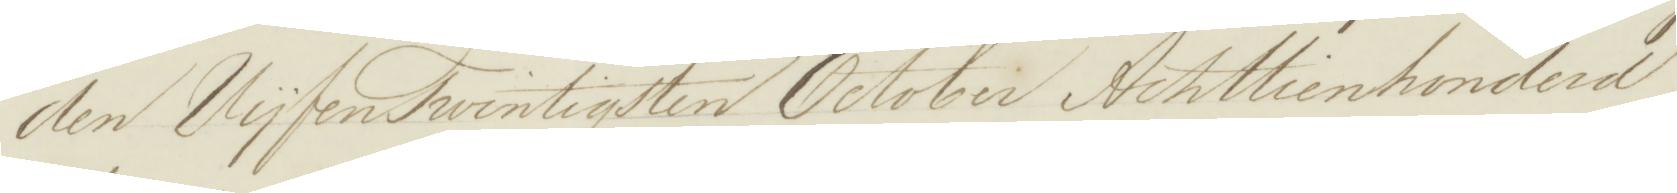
den Vijfen Twintigsten October Achttienhonderd
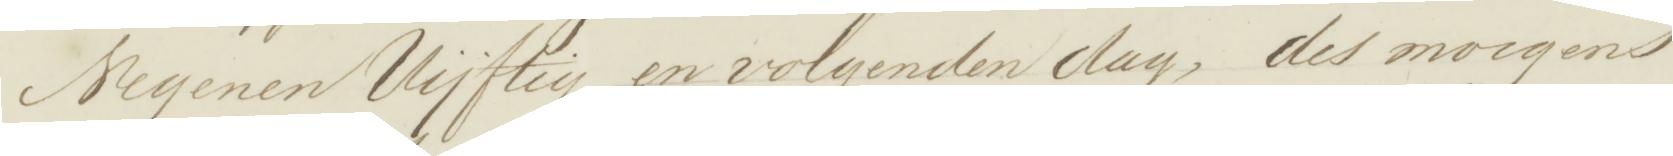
Negenen Vijftig en volgenden dag, des morgens
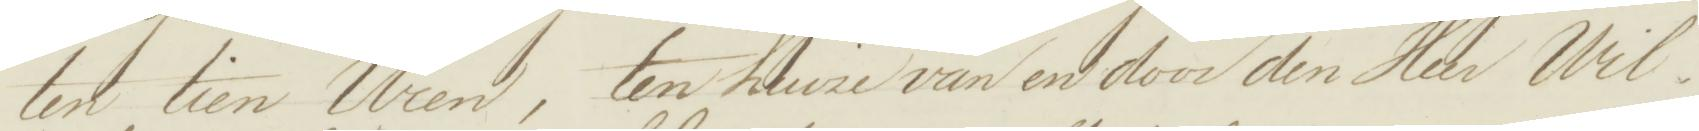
ten tien Uren, ten huize van en door den Heer Wil„
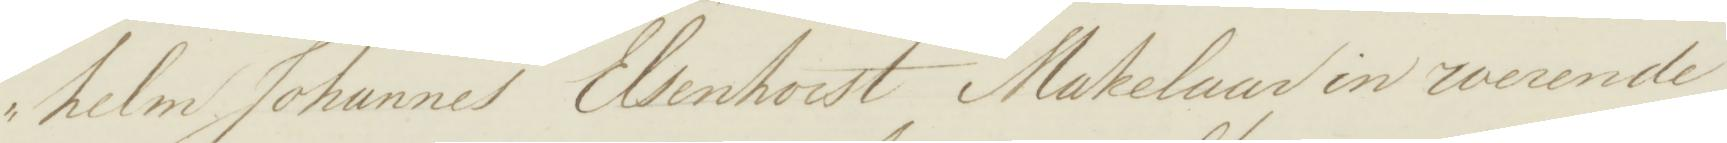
„ helm Johannes Elsenhorst Makelaar in roerende
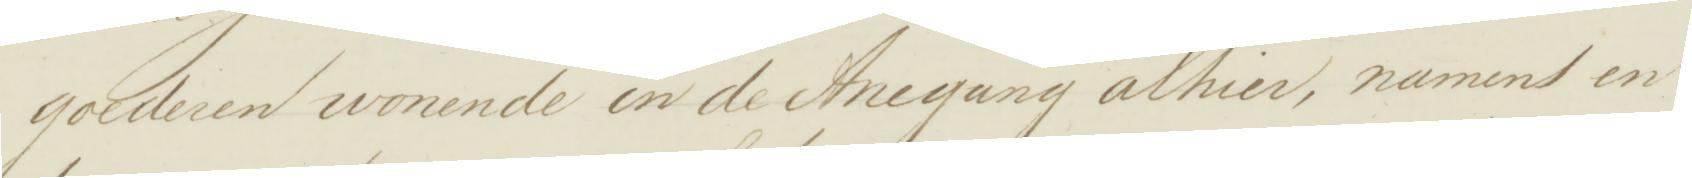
goederen wonende in de Anegang alhier, namens en
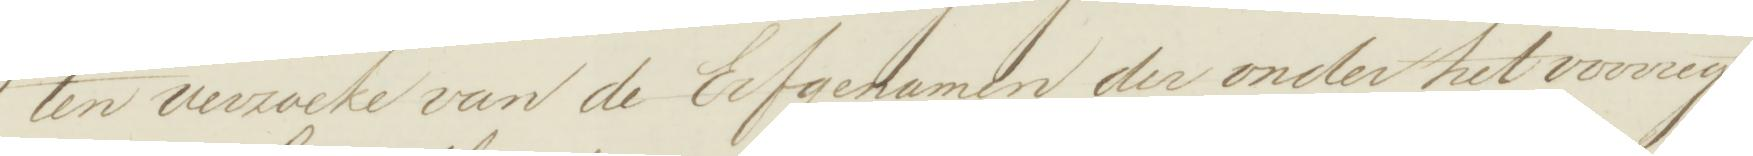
ten verzoeke van de Erfgenamen der onder het voorregt
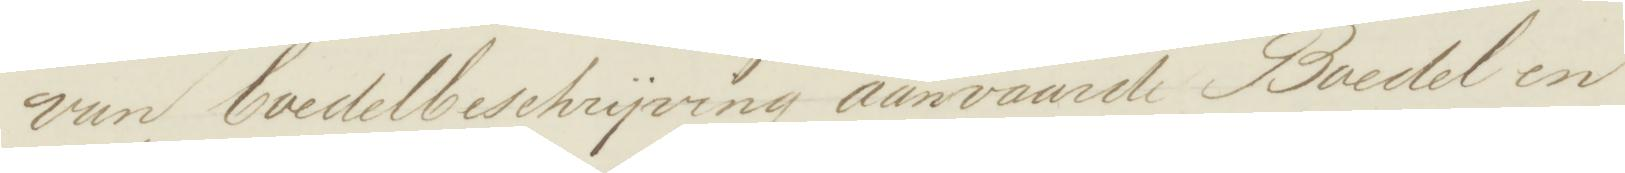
van boedelbeschrijving aanvaarde Boedel en
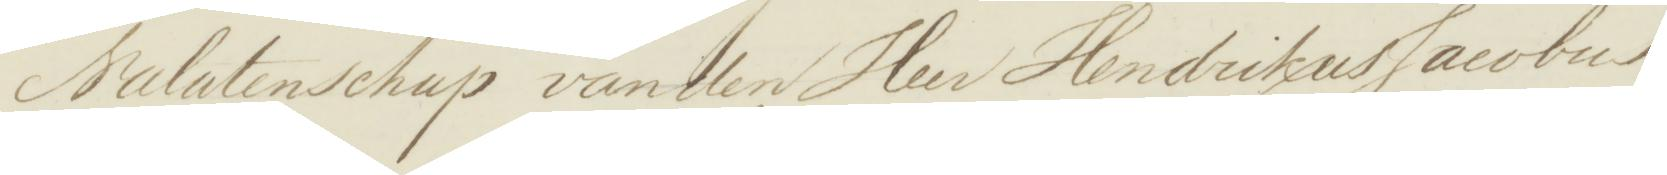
Nalatenschap van den Heer Hendrikus Jacobus
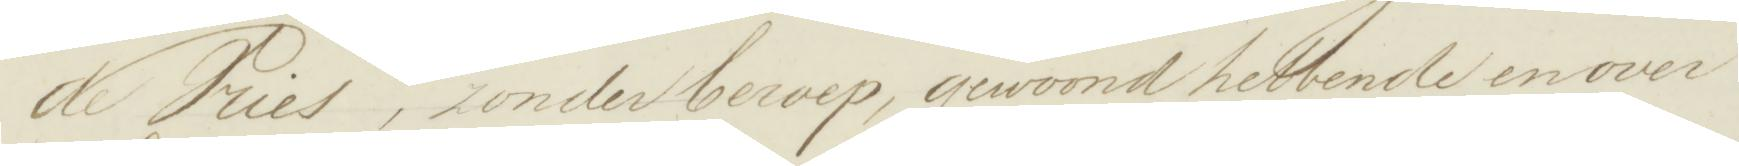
de Vries, zonder beroep, gewoond hebbende en over
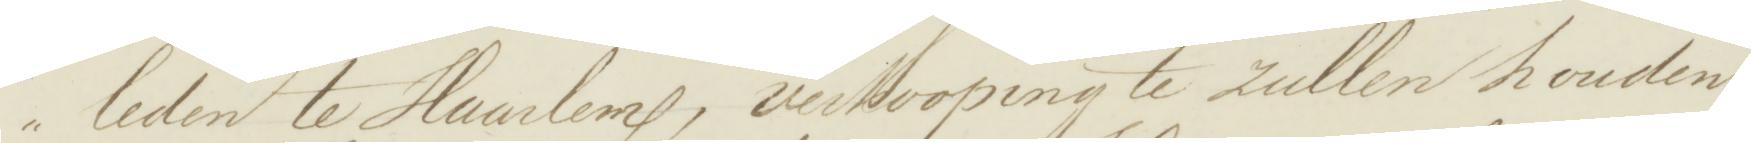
„ leden te Haarlem, verkooping te zullen houden
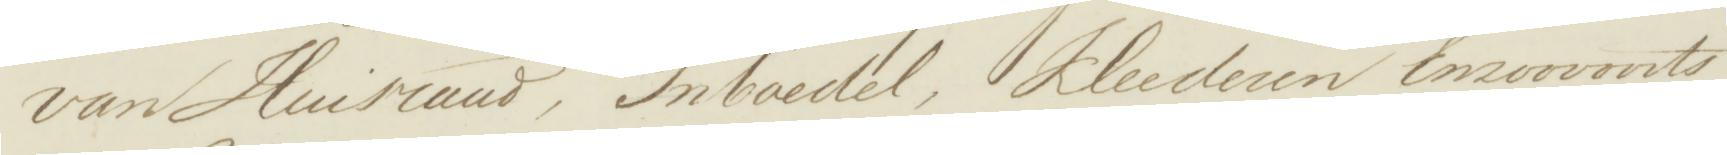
van Huisraad, Inboedel, Kleederen Enzoovoorts
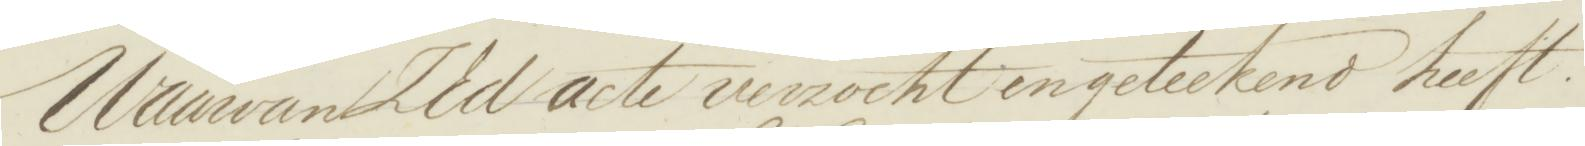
Waarvan ZEd acte verzocht en geteekend heeft.
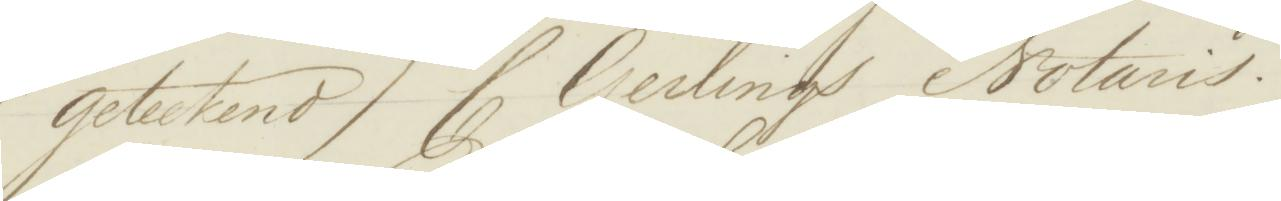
(geteekend) C Gerlings Notaris.
